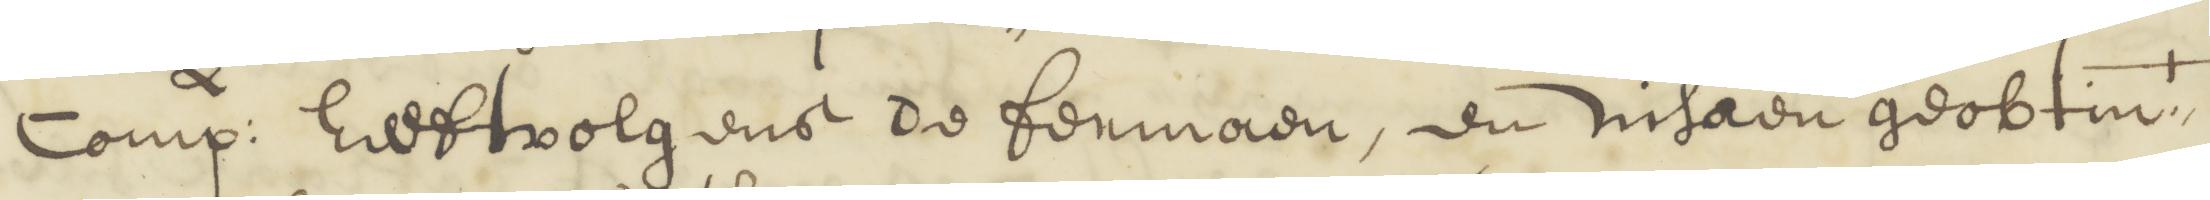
Comp: heeft volgens de fermaen, en nisaer geobtin„t
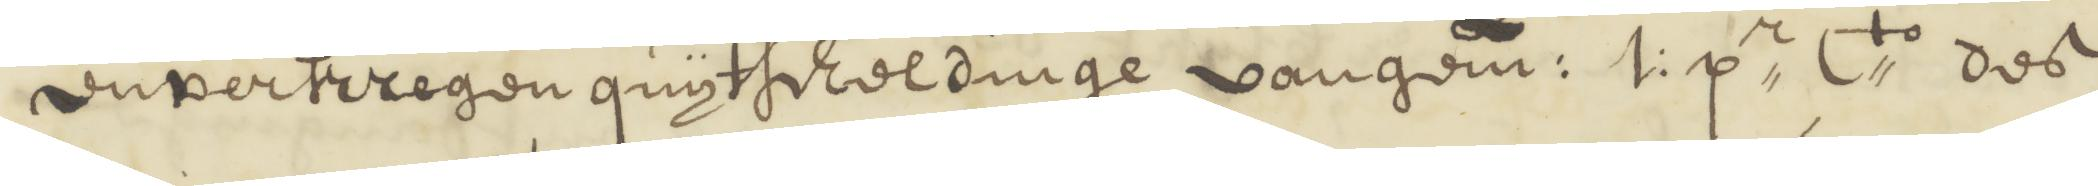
en verkregen quijtscheldinge vangem: 1: p„r C„to des
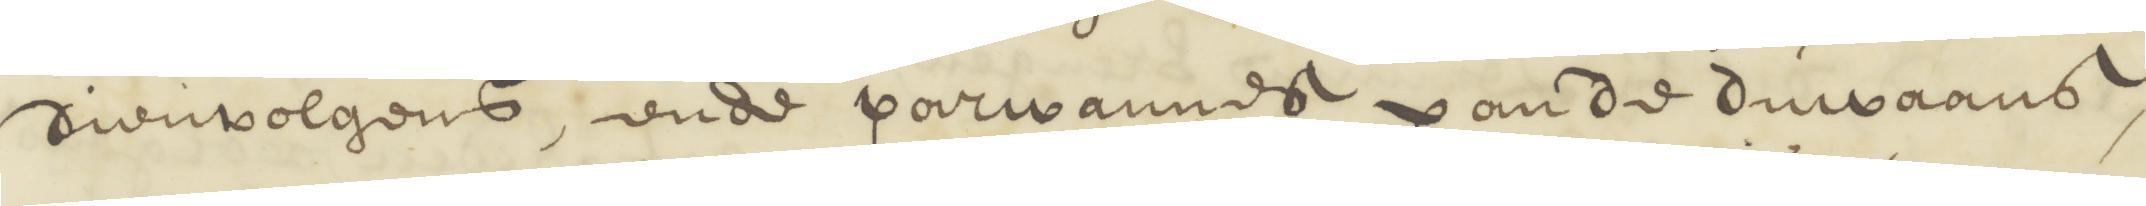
dienvolgens, ende parwannes van de duwaans
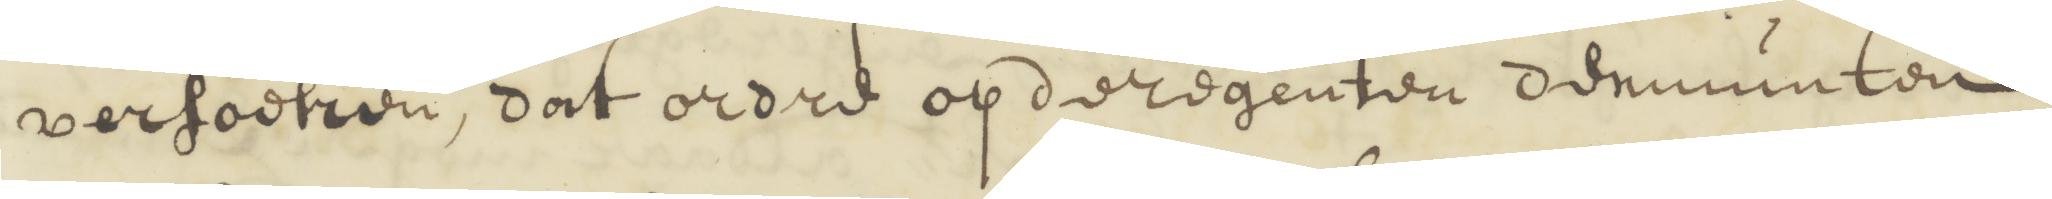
versoeken, dat ordre op de regenten dermunten
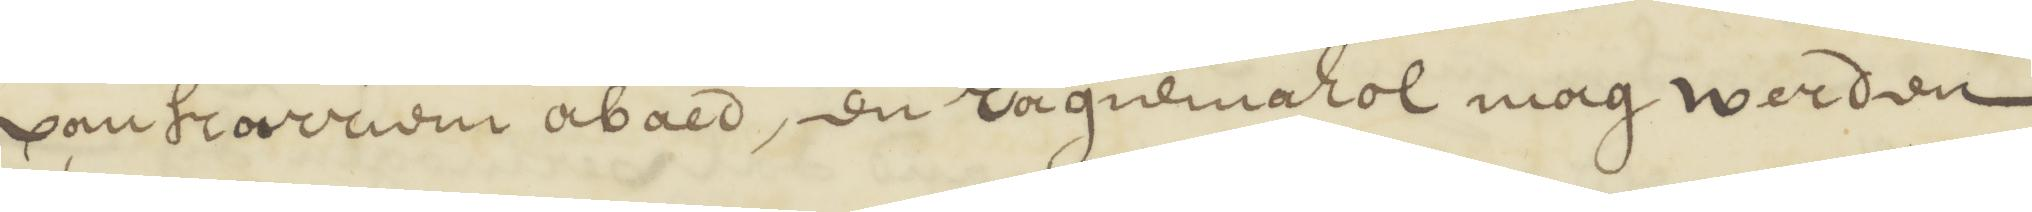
van karriem abaed, en ragiemahol mag werden
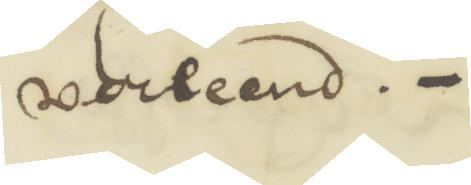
verleend.
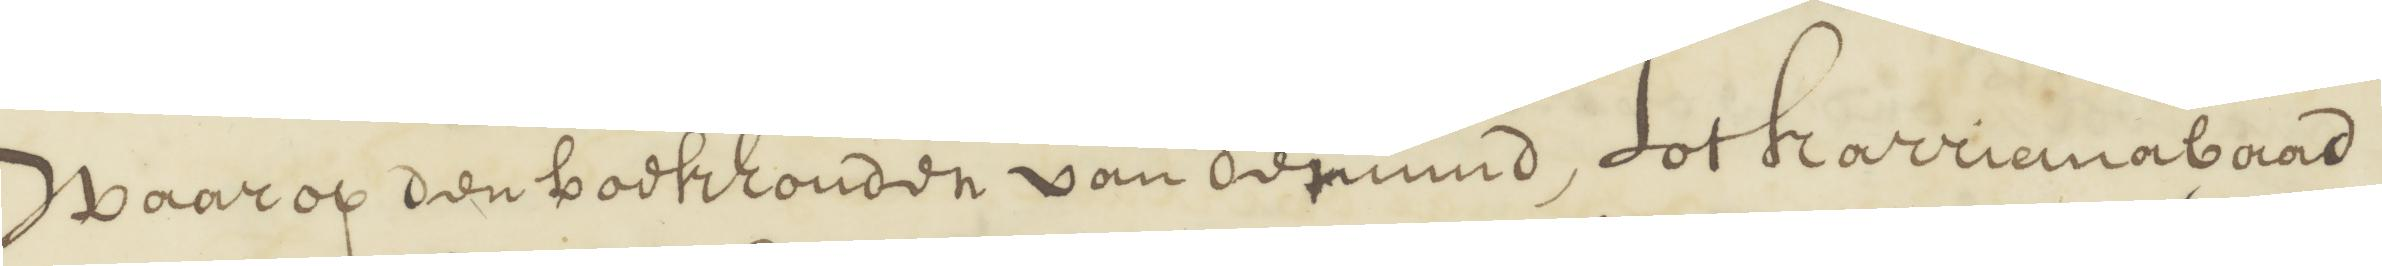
Waar op den boekhouder van demund, tot karriemabaad
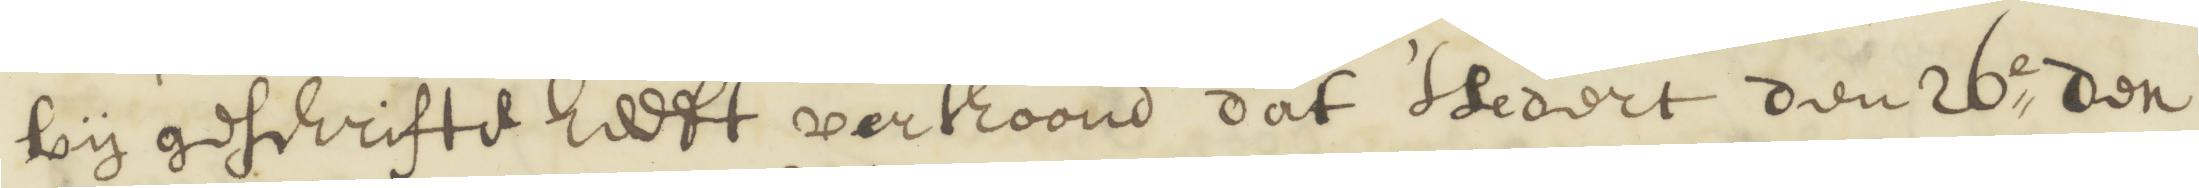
bij geschrifte heeft verthoond dat 'tsedert den 26„e der
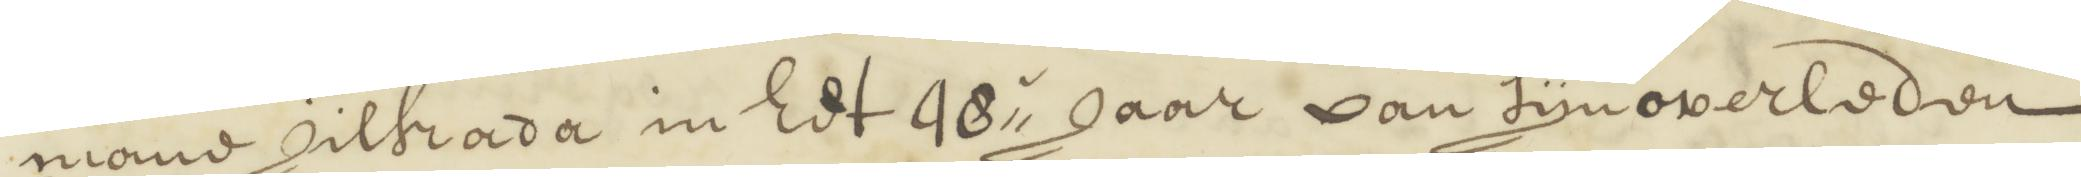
mane jilkada in het 48„' jaar van sijn overleden
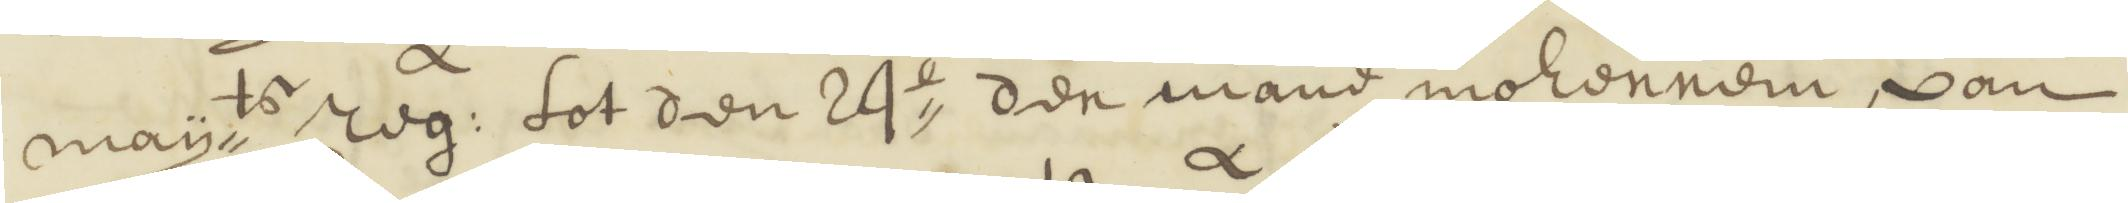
maij„ts reg: tot den 24„e der mane moherrem, van
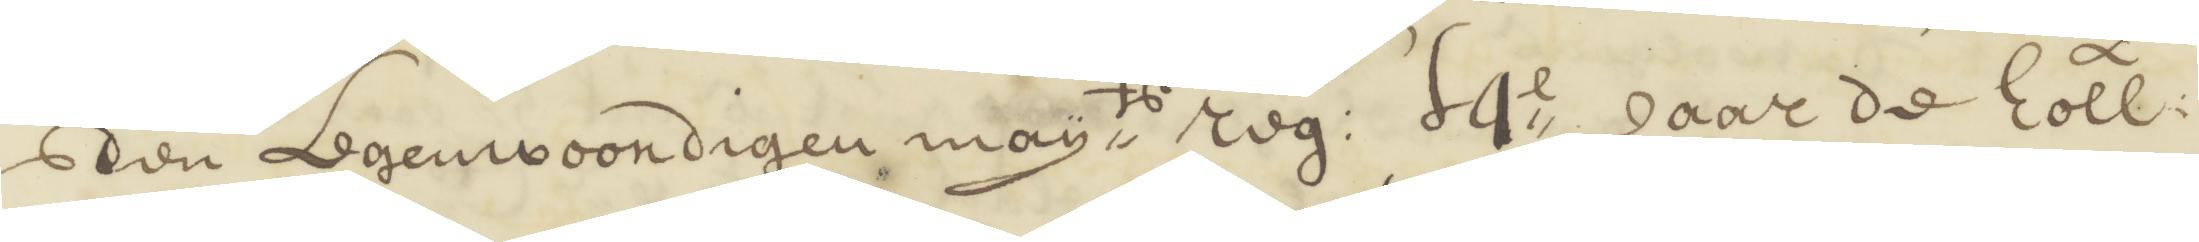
den tegenwoordigen maij„ts reg: 't 4„e Jaar de holl:
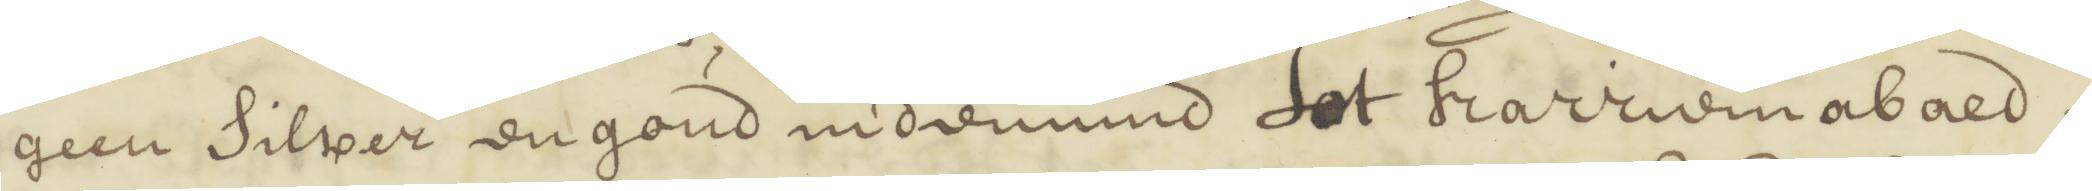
geen silver en goud in denmund tot karriem abaed
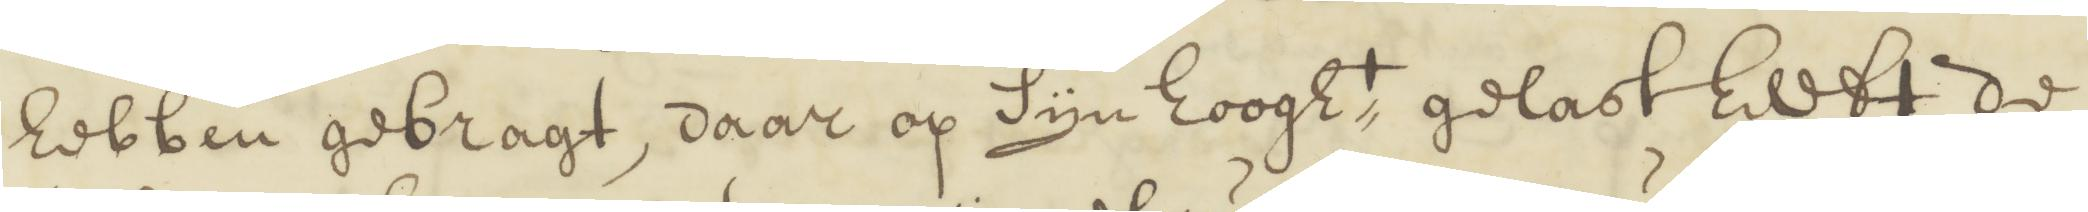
hebben gebragt, daar op sijn hoogh„t gelast heeft de
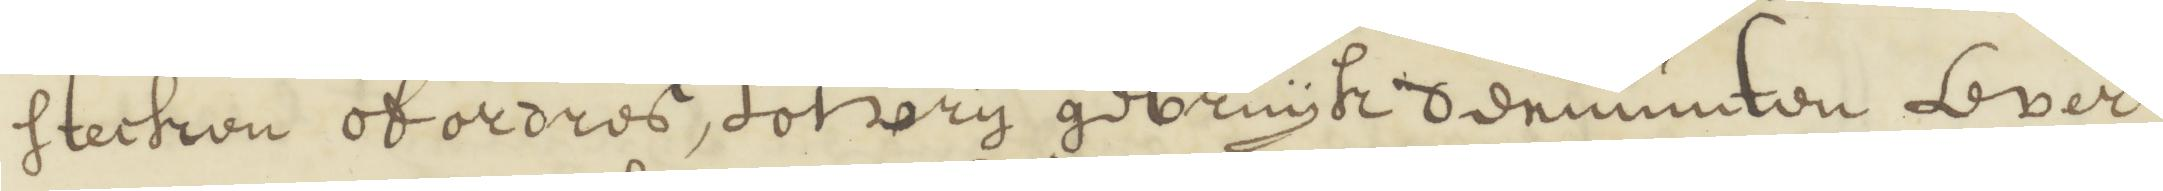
stecken of ordres, tot vrij gebruijk dermunten tever
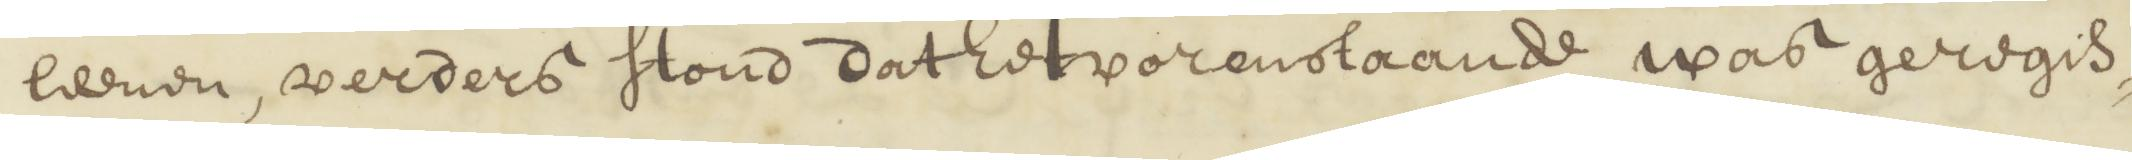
leenen, verders stond dat het vorenstaande was geregis„
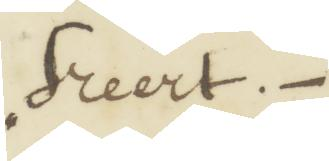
„treert.
